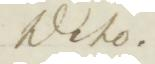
Dito . . . . . . . . .
